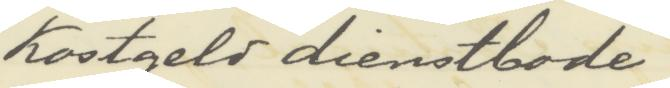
Kostgeld dienstbode
